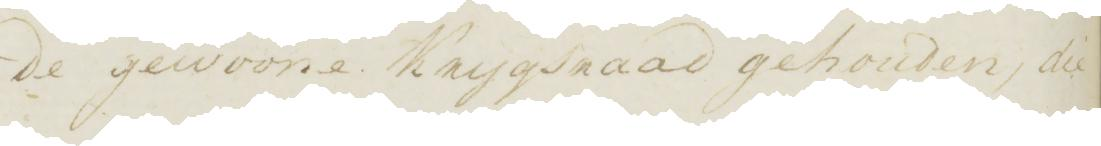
de gewoone Krijgsraad gehouden, die
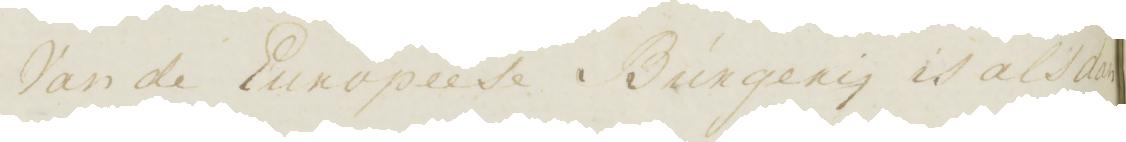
Van de Europeese Burgerij is als dan
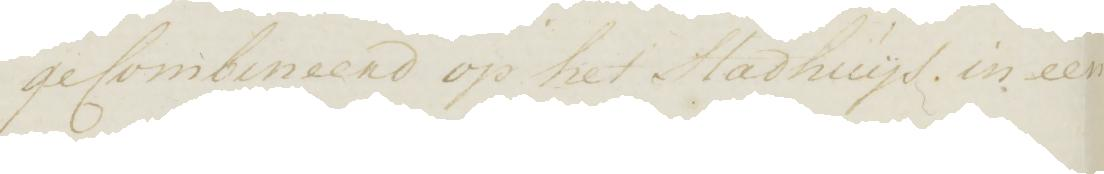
gecombineerd op het Stadhuijs. in een
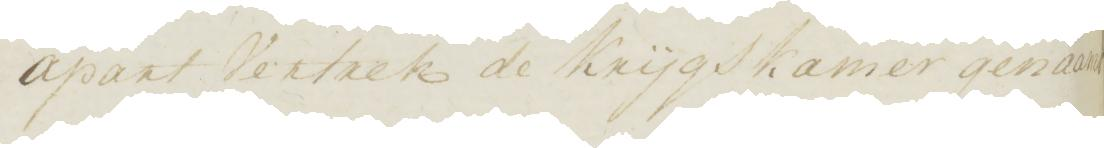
apart Vertrek de Krijgskamer genaamt
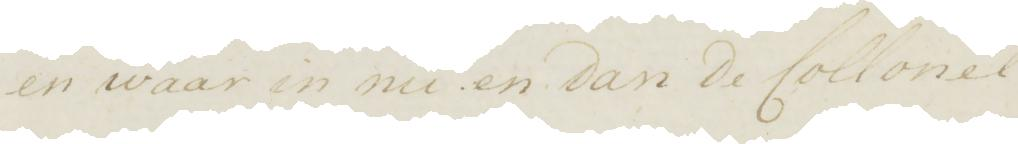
en waar in nu en dan de Collonel
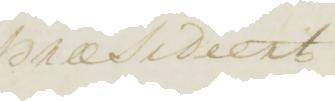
præsideert
